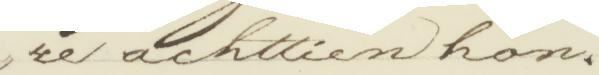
re achttien hon„
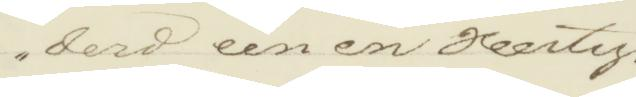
„derd een en veertig.
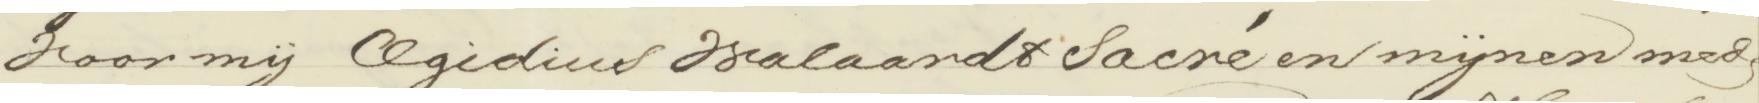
Voor mij Aegidius Walaardt Sacré en mijnen meden
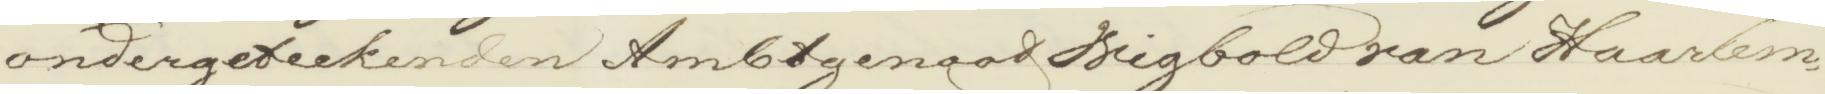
ondergeteekenden Ambtgenoot Wigbold van Haarlem,
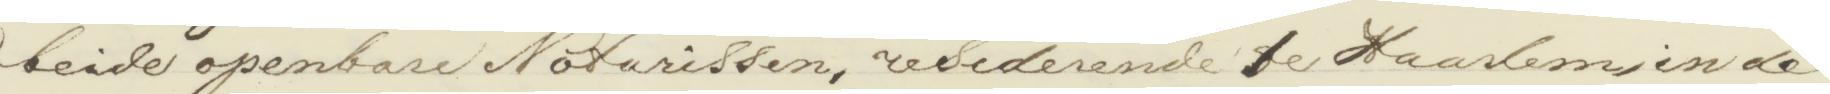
beide openbare Notarissen, residerende te Haarem in de
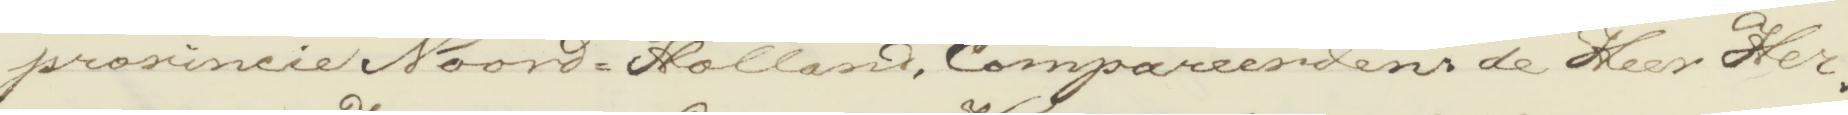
provincie Noord=Holland, Compareerden de Heer Her„
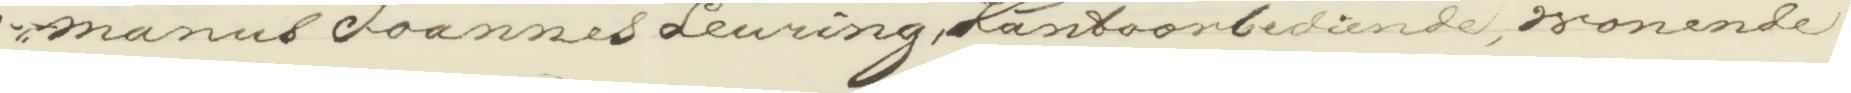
„manus Joannes Leuring, Kantoorbediende, wonende
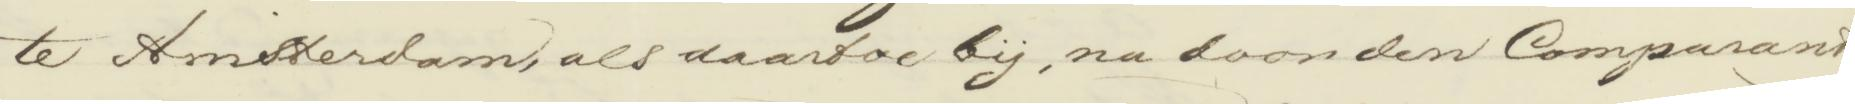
te Amsterdam, als daartoe bij, na door den Comparant
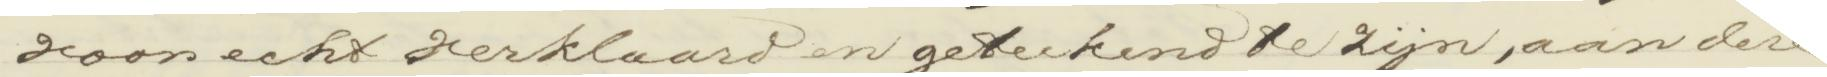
voor echt verklaard en geteekend te zijn, aan deze
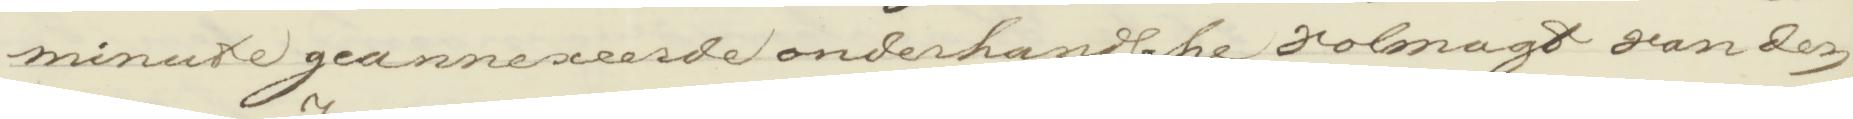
minute geannexeerde onderhandsche volmagt van den
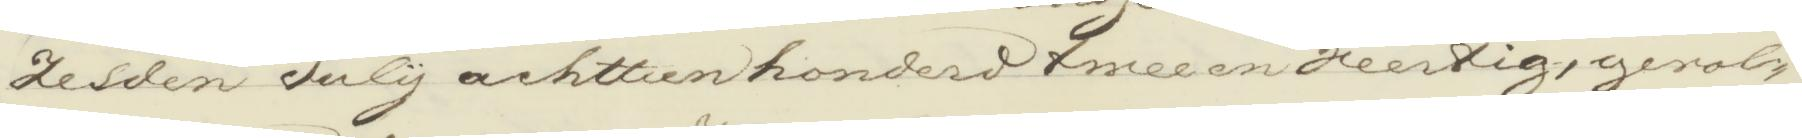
zesden Julij achttien honderd twee en veertig, gevol„
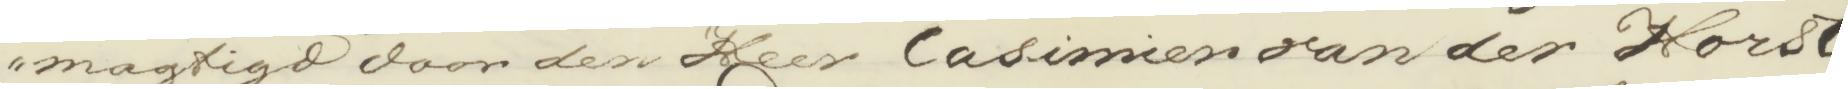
„magtigd door den Heer Casimier van der Horst,
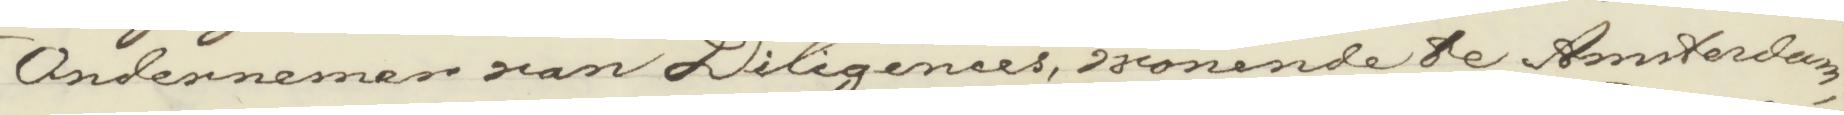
Ondernemer van Diligenees, wonende te Amsterdam,
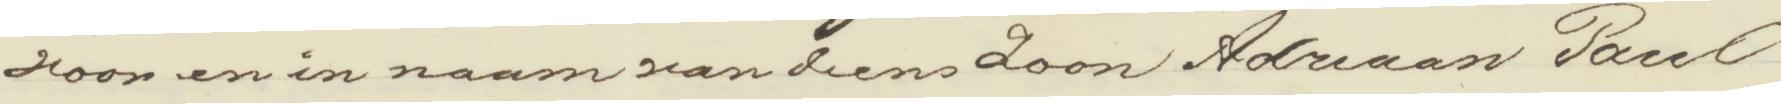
voor en in naam van diens zoon Adriaan Paul
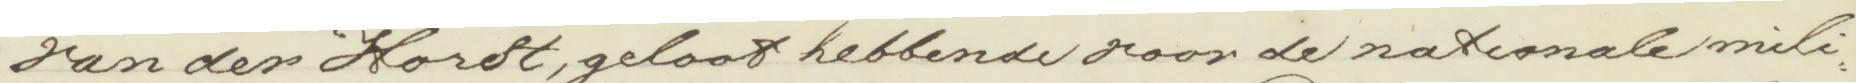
van der Horst, geloot hebbende voor de nationale mili„
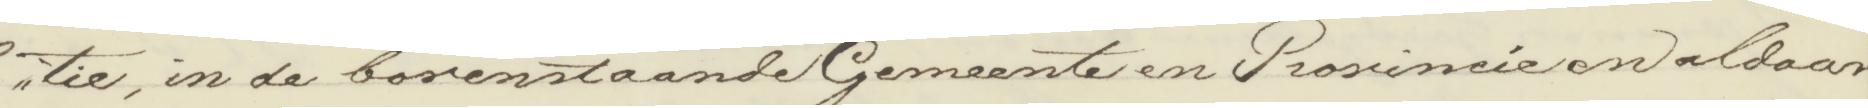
„tie, in de bovenstaande Gemeente en Provincie en aldaar
